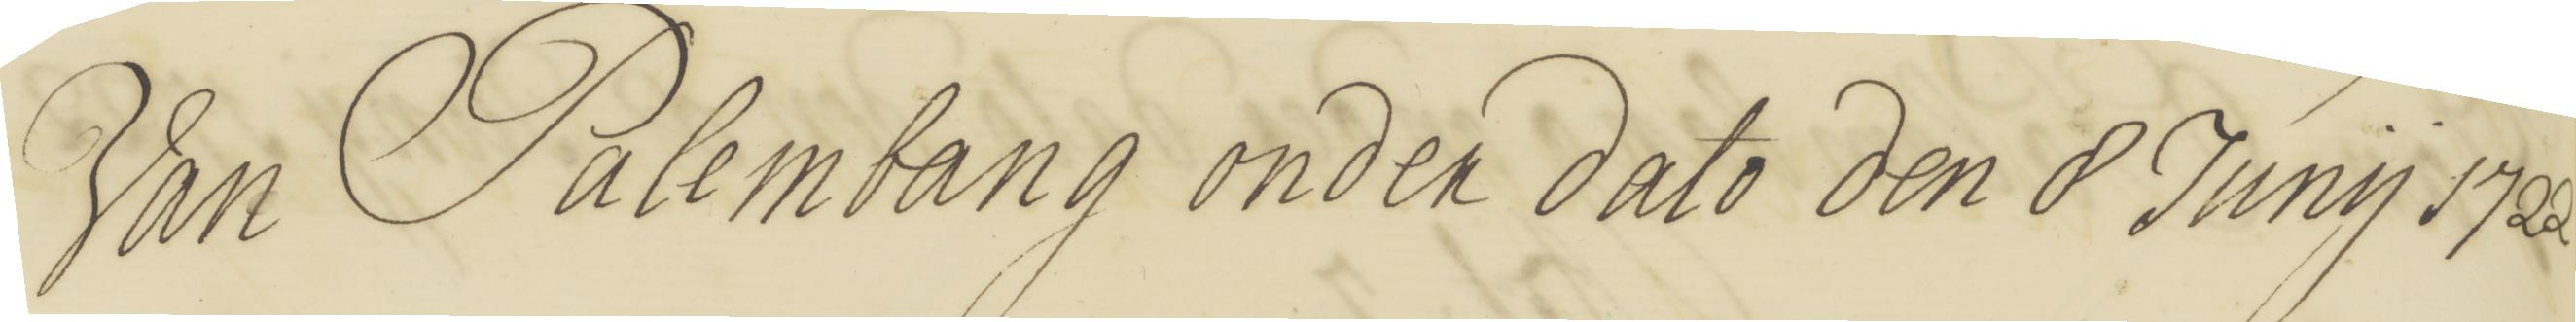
Van Palembang onder dato den 8 Iunij 1722
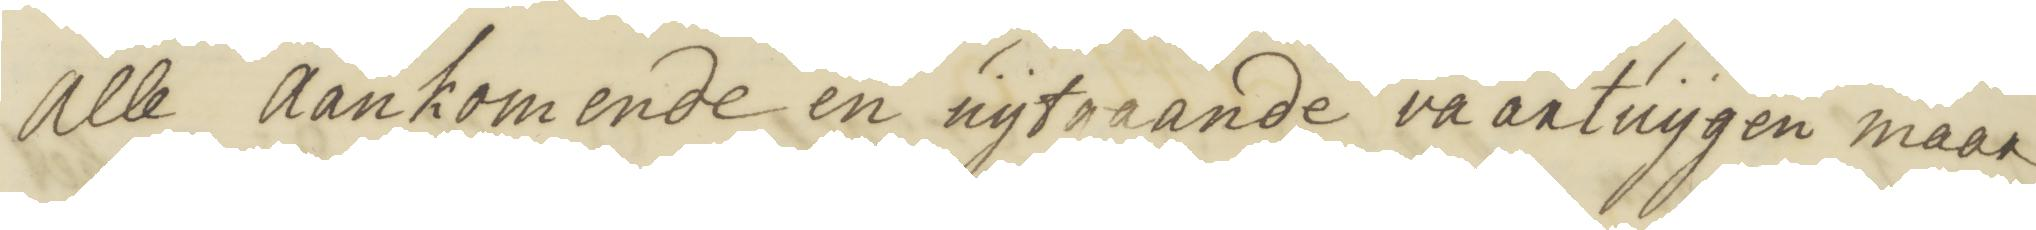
Alle aankomende en uijtgaande vaartuijgen waar
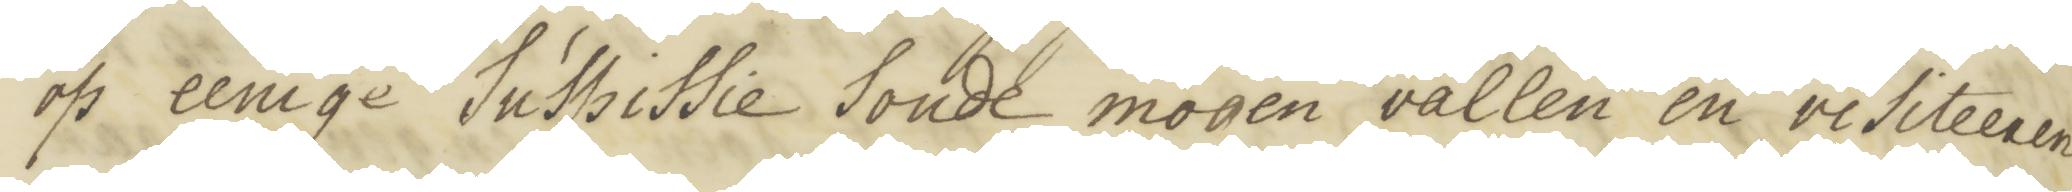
op eenige suspissie soude mogen vallen en visiteeren
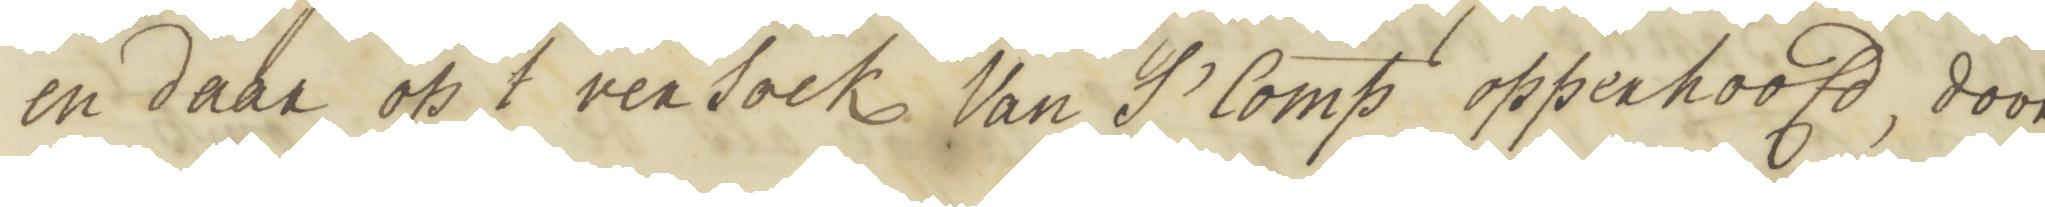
en daar op t versoek Van s'Comps opperhoofd, door
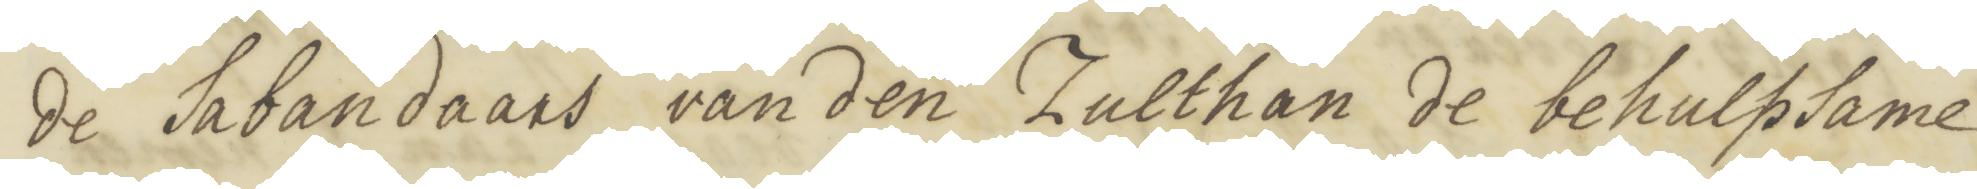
de sabandaars van den Zulthan de behulpsame
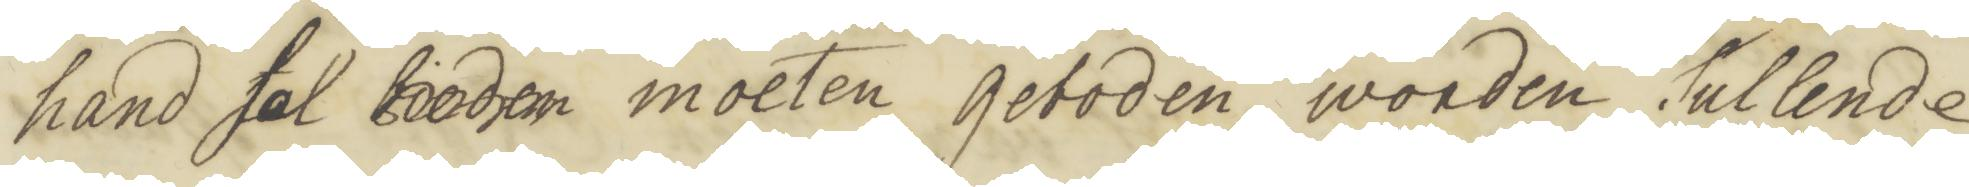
hand sal bieden moeten geboden worden sullende
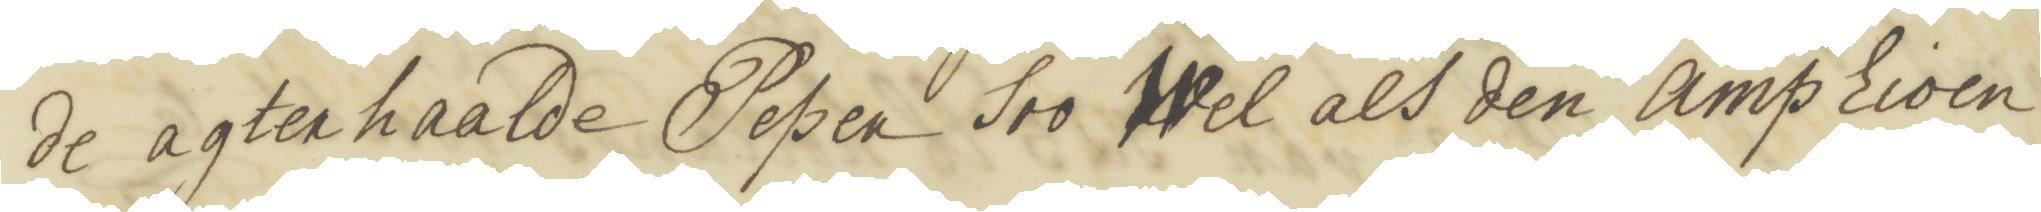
de agterhaalde Peper soo Wel als den Amphioen
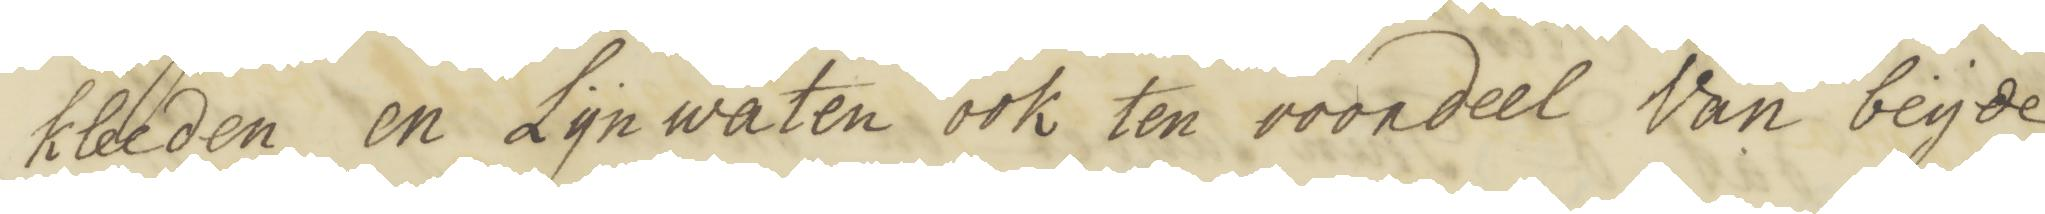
kleeden en Lijnwaten ook ten voordeel Van beijde
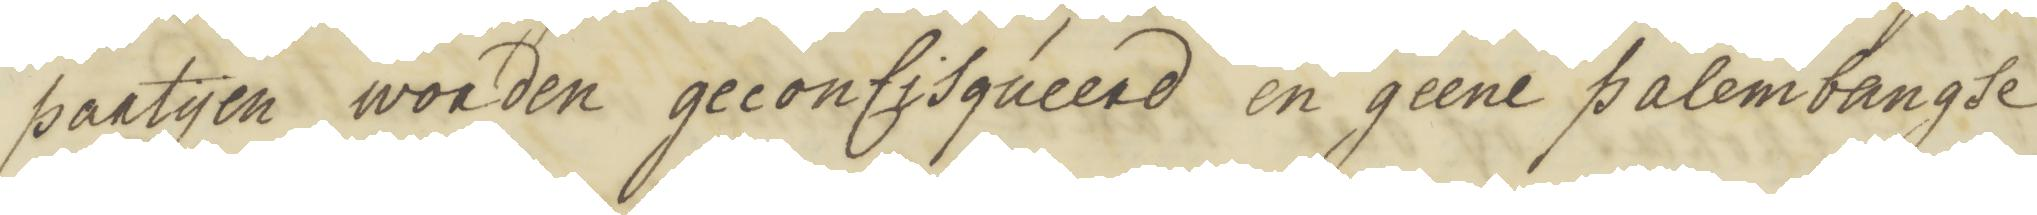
partijen worden geconfisqueerd en geene palembangse
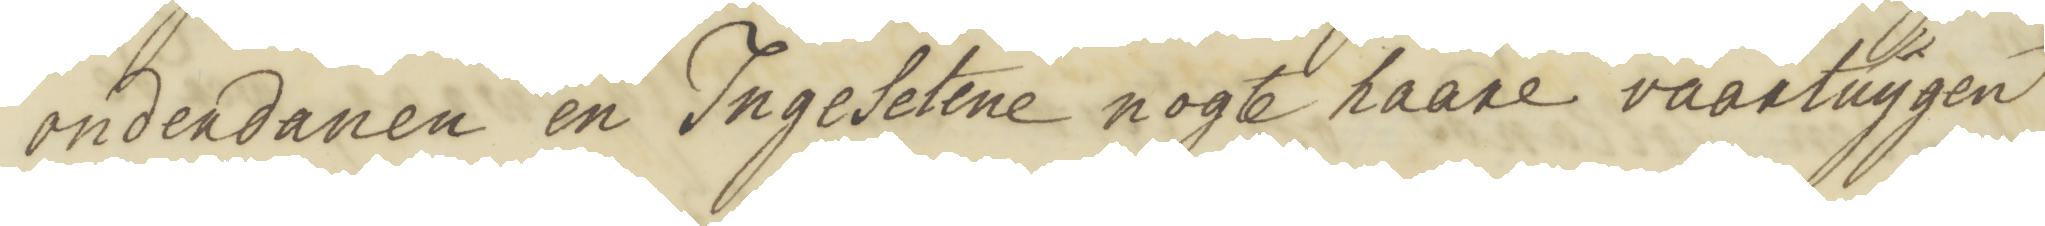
onderdanen en Ingesetene nogte haare vaartuijgen
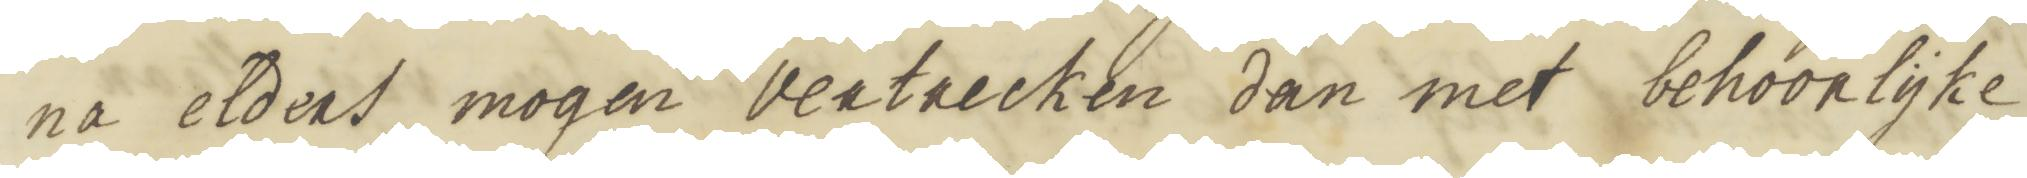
na elders mogen vertrecken dan met behoorlijke
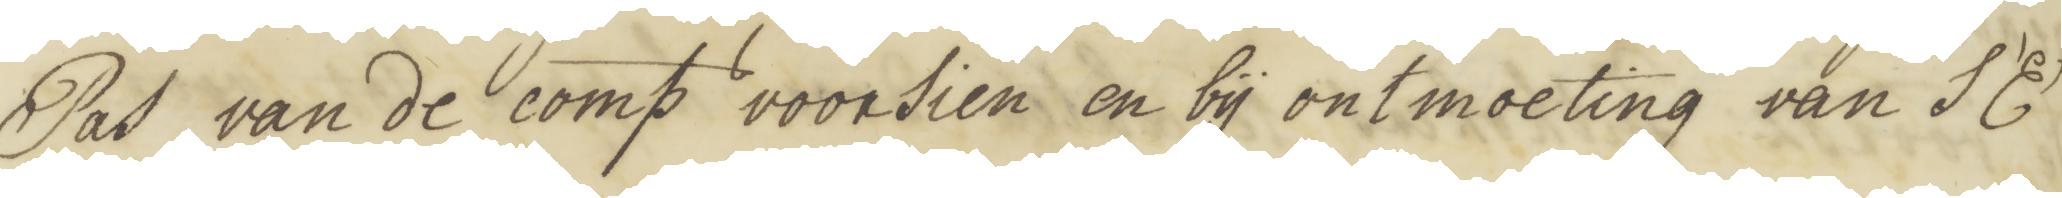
Pas van de comps voorsien en bij ontmoeting van s'E'
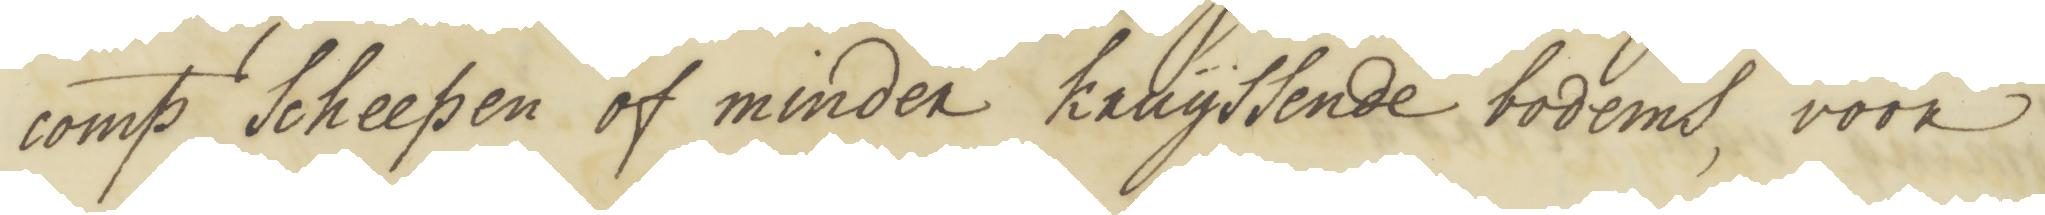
comps scheepen of minder kruijssende bodems, voor
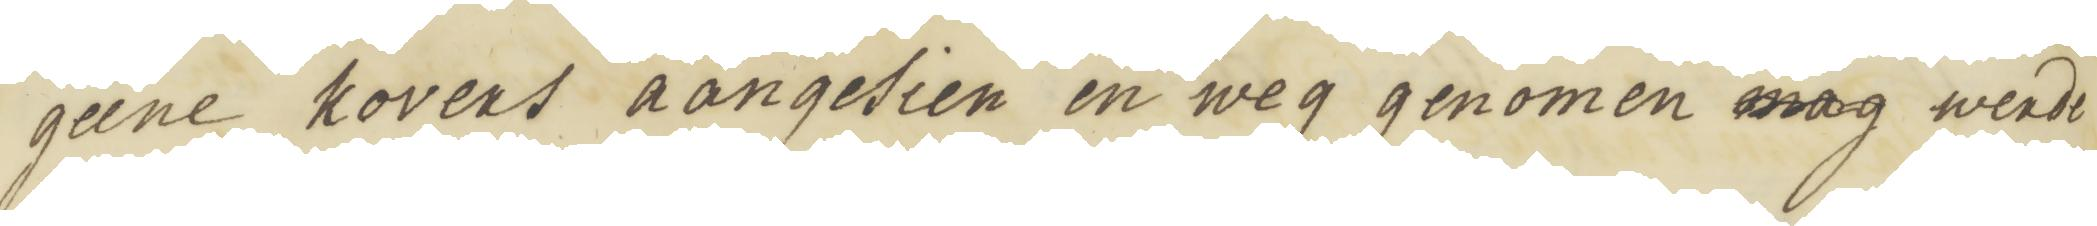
geene kovers aangesien en weg genomen mag werde
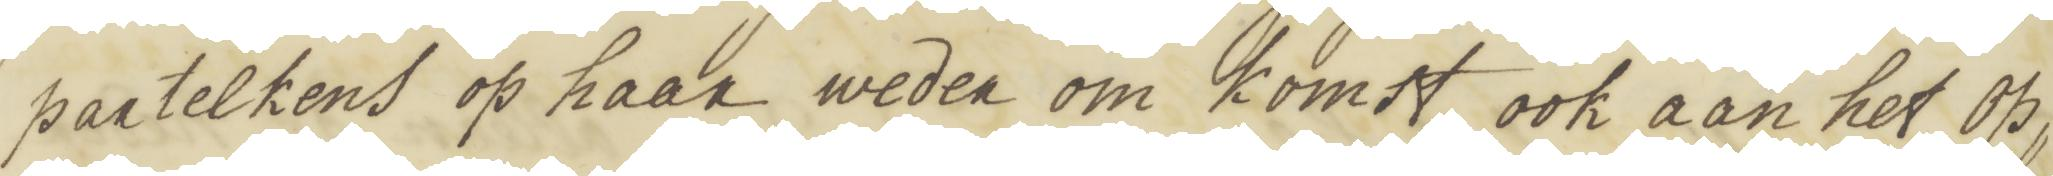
partelkens op haar weder om komst ook aan het op„
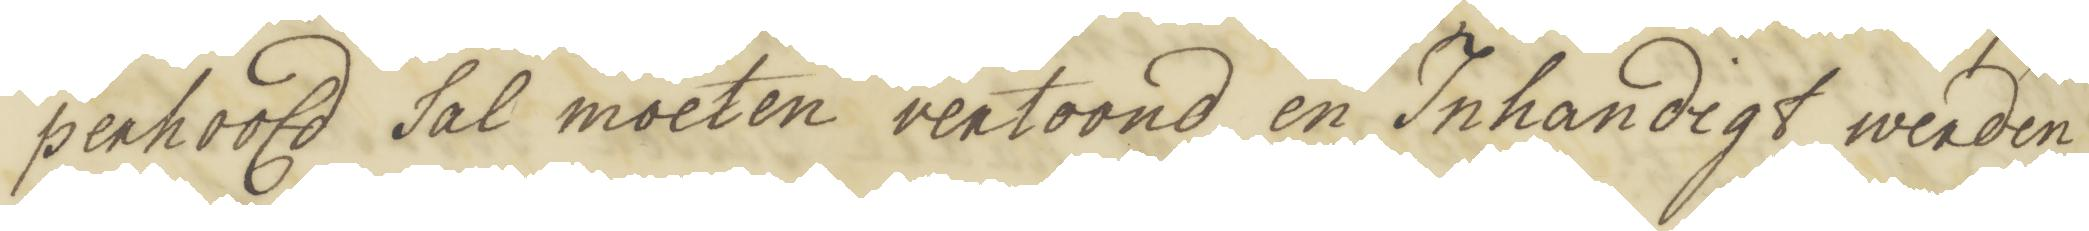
perhoofd sal moeten vertoond en Inhandigt werden
